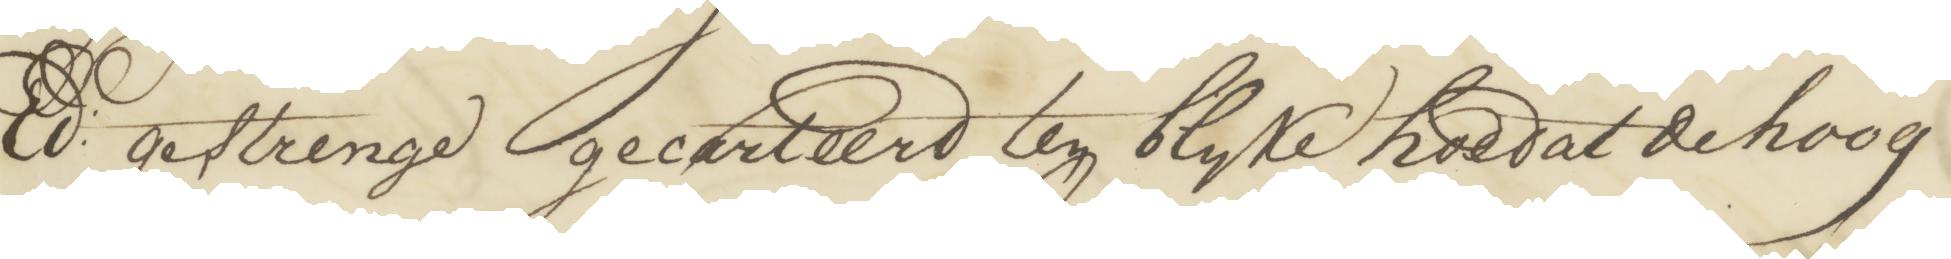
Ed:e gestrenge gecarteerd, ten blyke hoedat de hoog
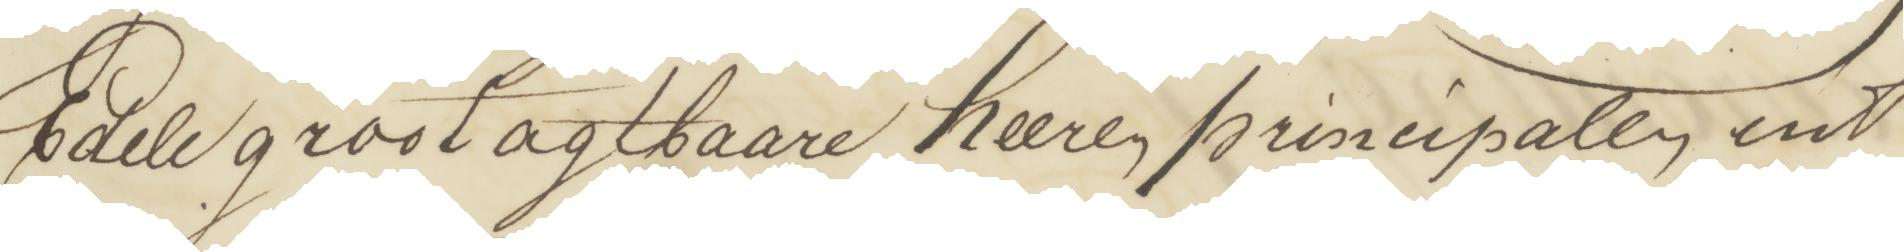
Edele groot agtbaare heeren principalen int
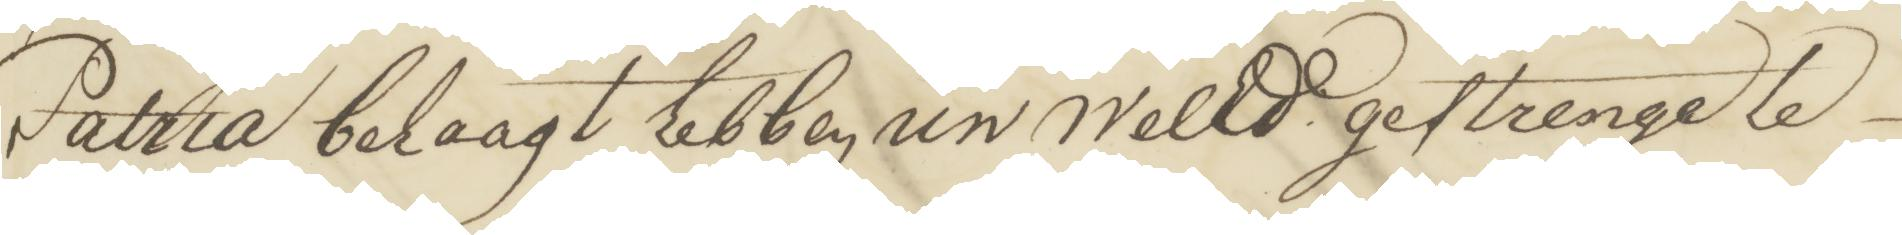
Patria behaagt hebben uw welEd:e gestrenge te
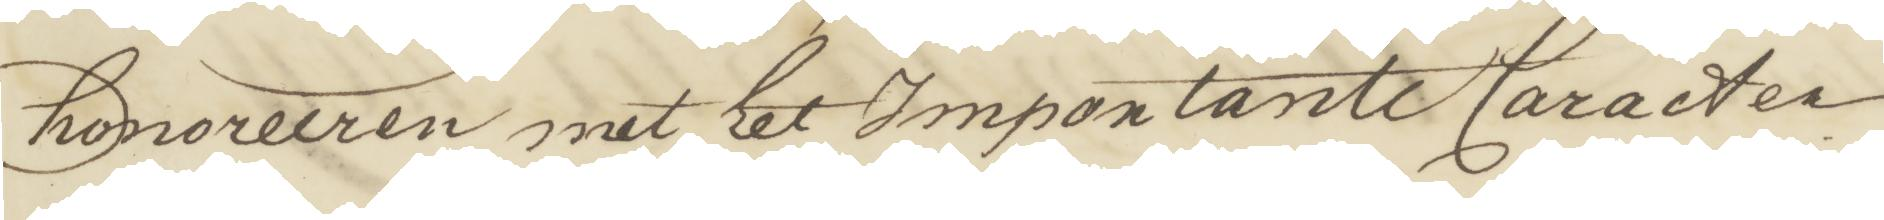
honoreeren met het Jmportante Caracter
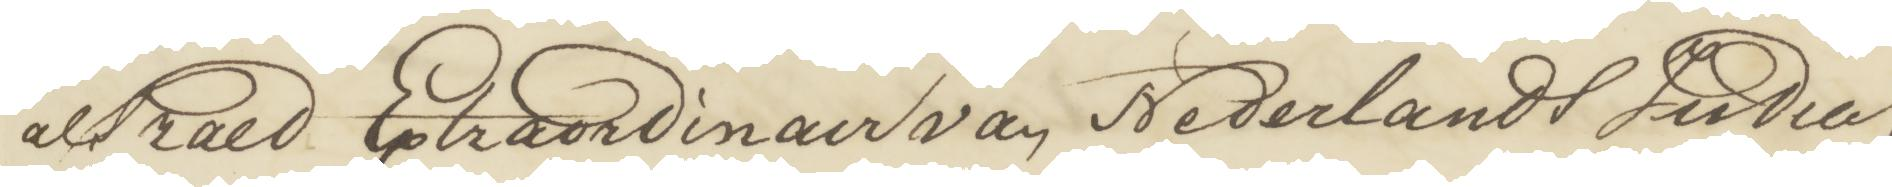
als raed Extraordinair van Nederlands Jndia
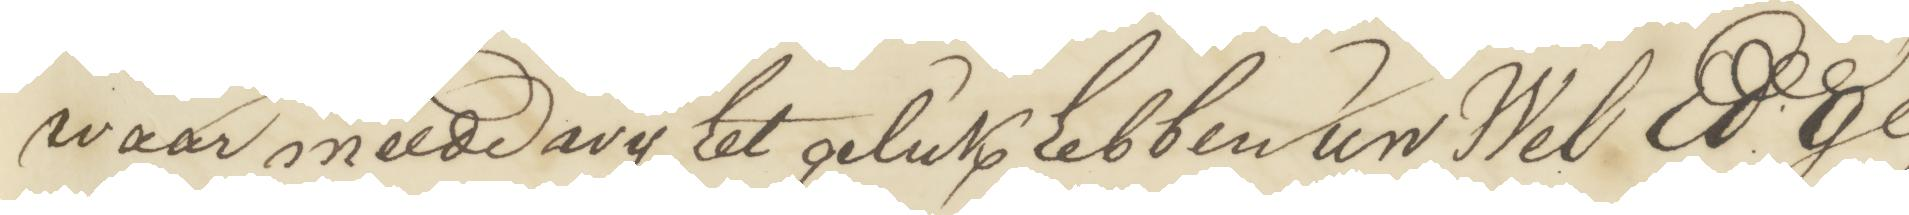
waar meede wij het geluk hebben uw Wel Ed:le ge
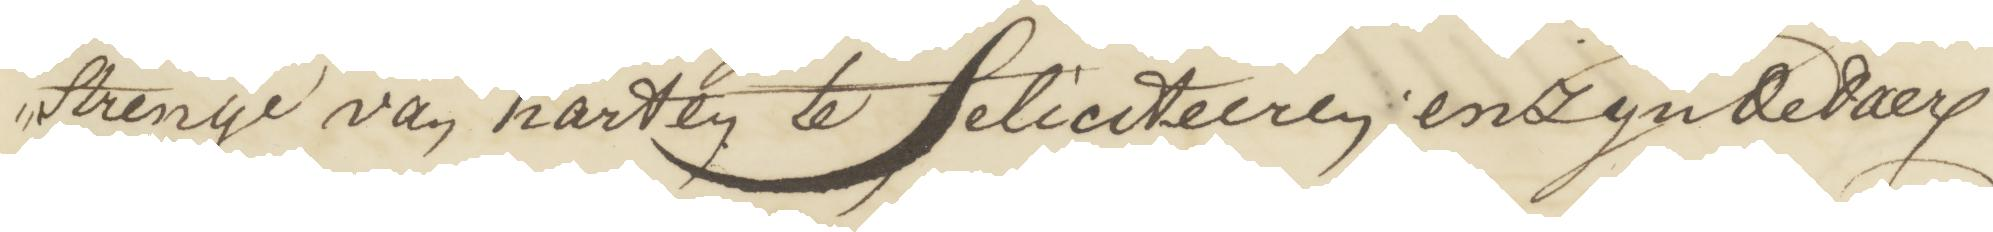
„strenge van harten te feliciteeren; en zijn de daer
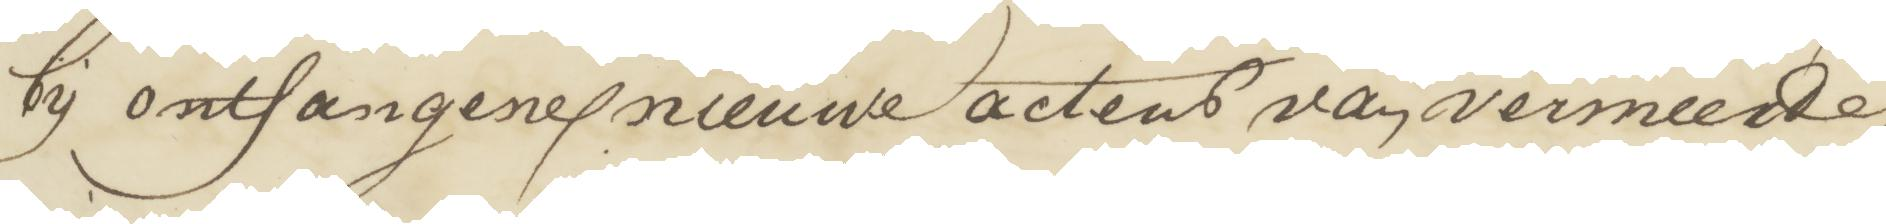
bij ontfangene nieuwe actens van vermeerde
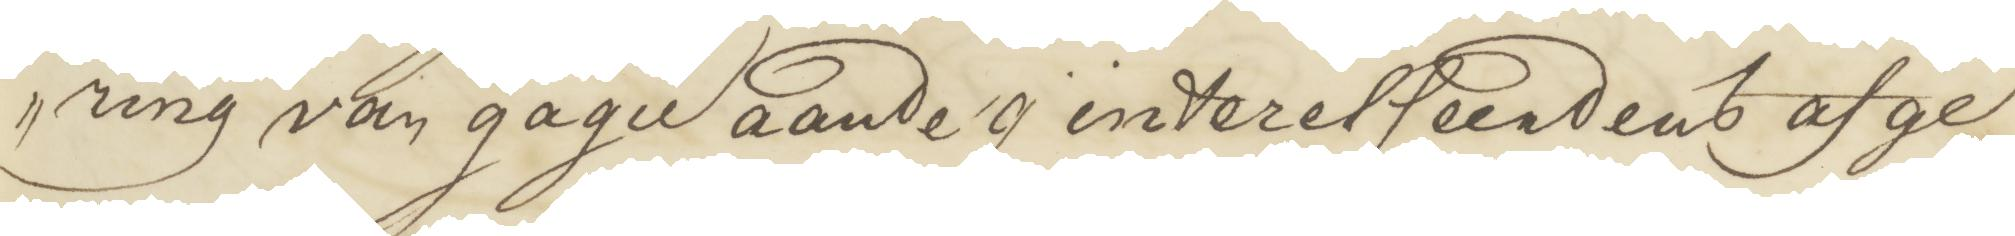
„ring van gagie aande g’interesseerdens afge
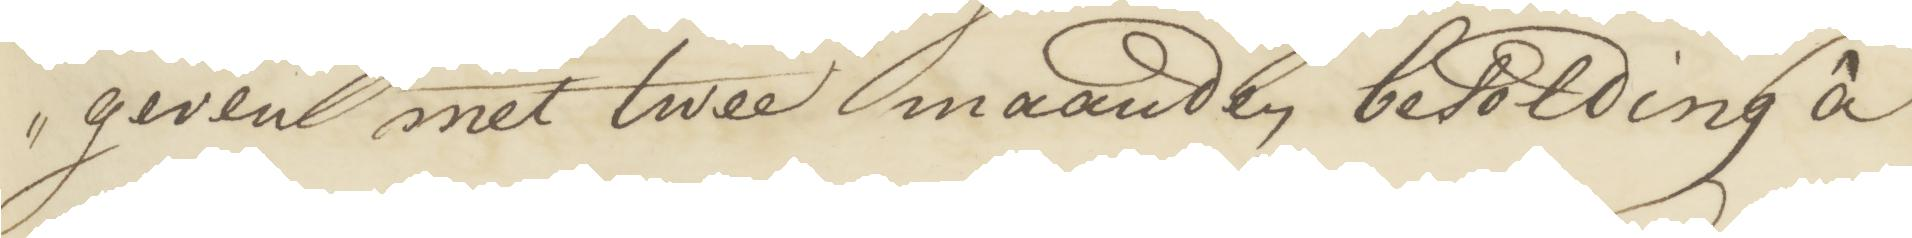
„geven met twee maanden besolding â
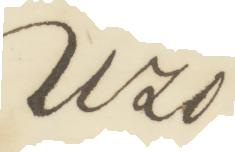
uzo
